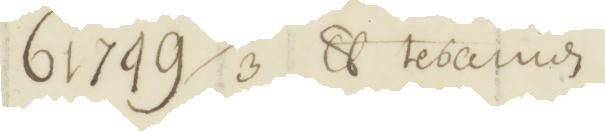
61749 1/3 lb tesamen
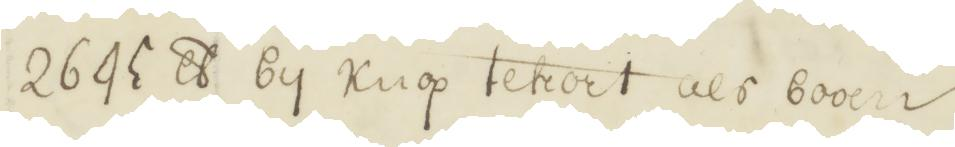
2645 lb bij Knop tekort als boven
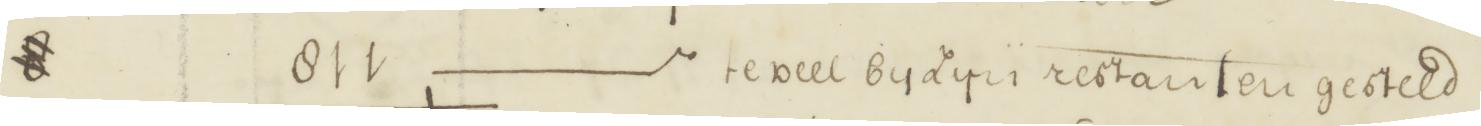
8 811 —:o te veel by Zijn restanten gesteld
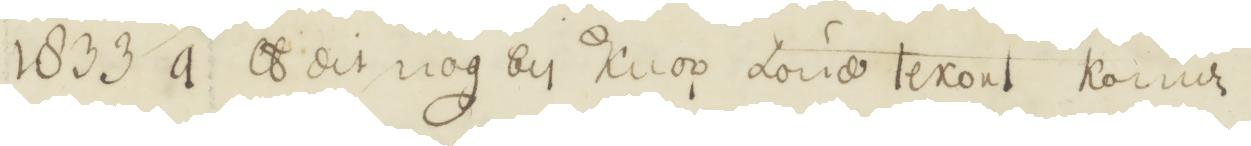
1833 1/4 lb dit nog by Ø Knop zoude tekort komen
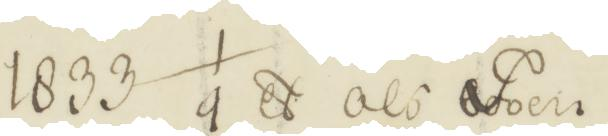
1833 1/4 lb als Toen
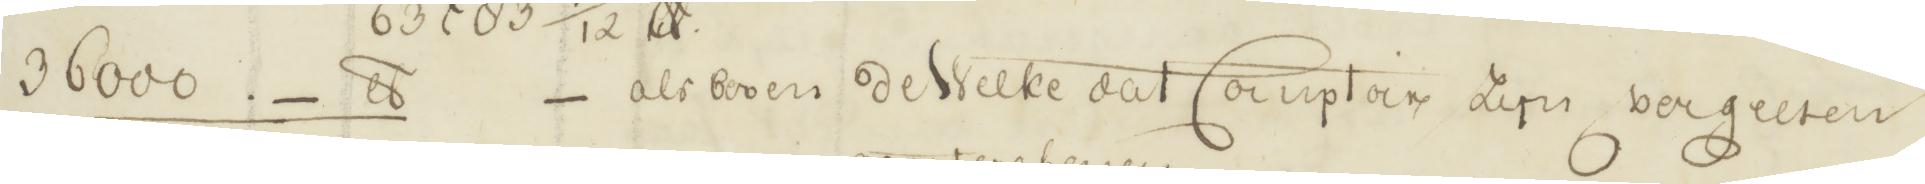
36000 — lb — als boven de welke dat Comptoir zyn vergeeten
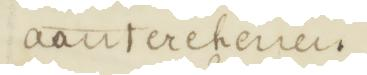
aan terekenen
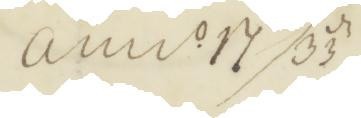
anno 17 32/en33
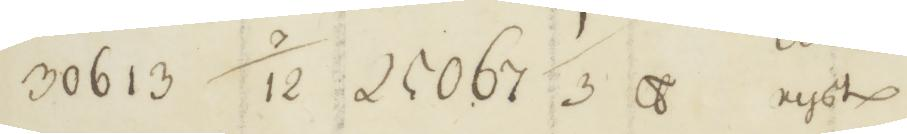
30613 7/12 25067 1/3 lb ryst
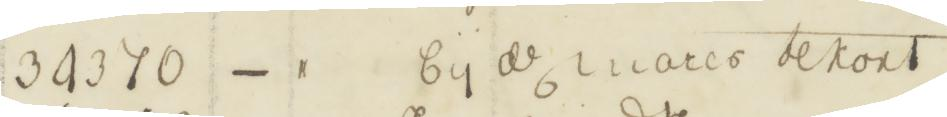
34370 — „ bij de mares tekort
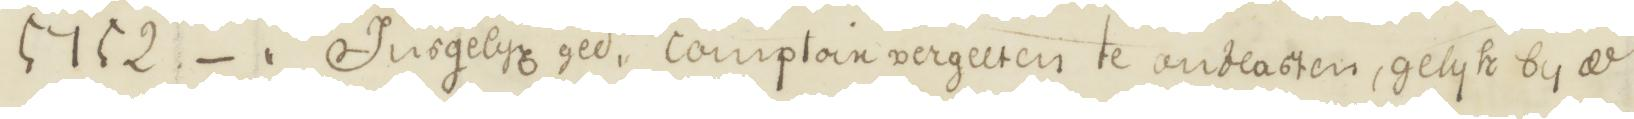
5152 — „ Insgelyx ged„te comptoir vergeeten te ontlasten, gelyk by de
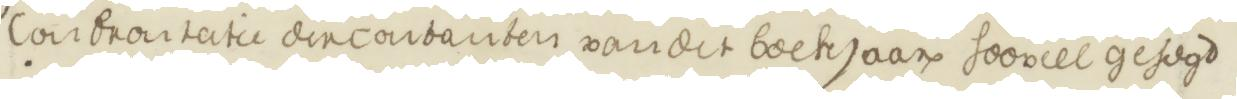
Confrontatie der contanten van dit boekjaar Sooveel gesegd
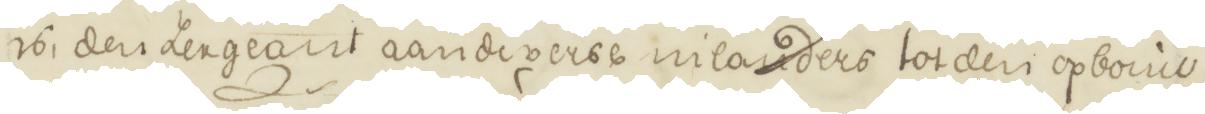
is, den Zergeant aan diverse inlanders tot den opbouw
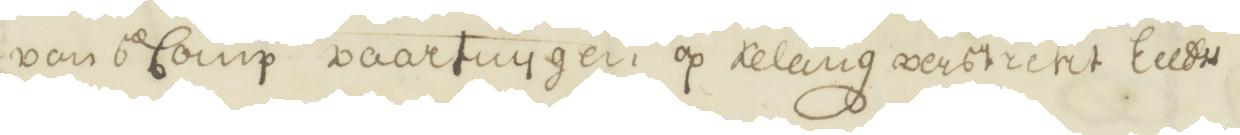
van s Comp's vaartuygen op Kelang verstrekt heeft
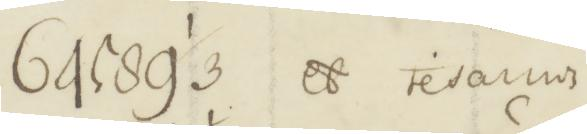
64589 1/3 lb tesamen
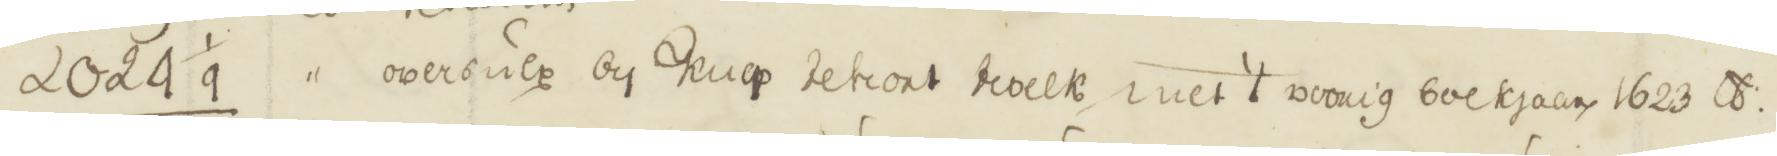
2024 ¼ „ over sulx by knop tekort twelk met ’t voorig boekjaar 1623 lb:
